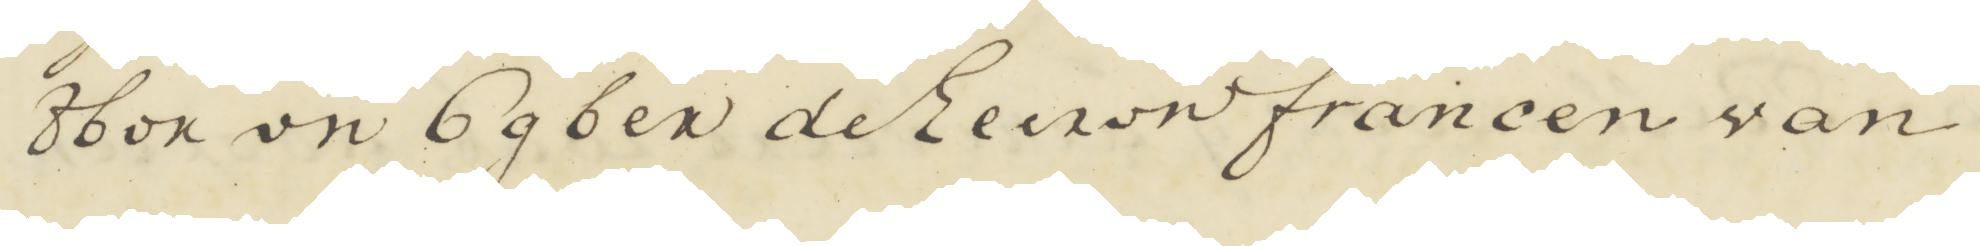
8ber en 6 9ber de heeren francen van
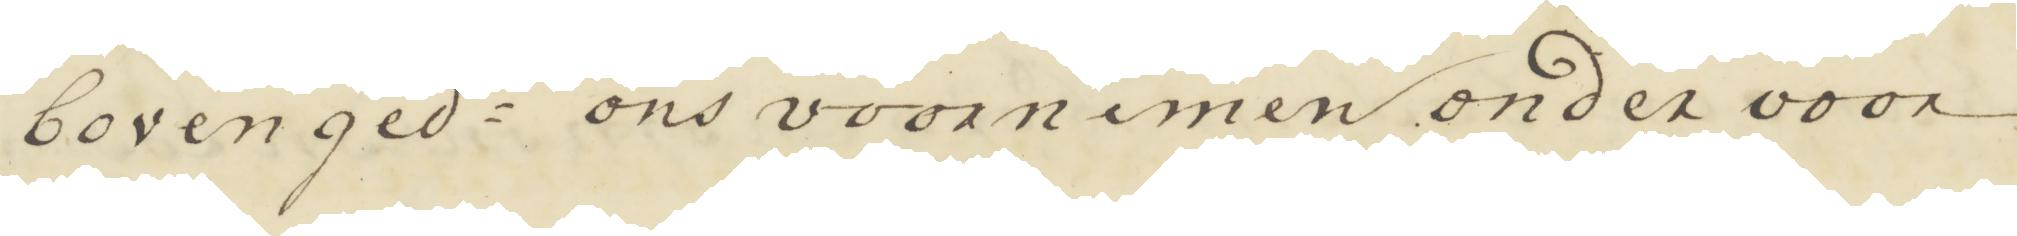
bovenged=t ons voornemen onder voor
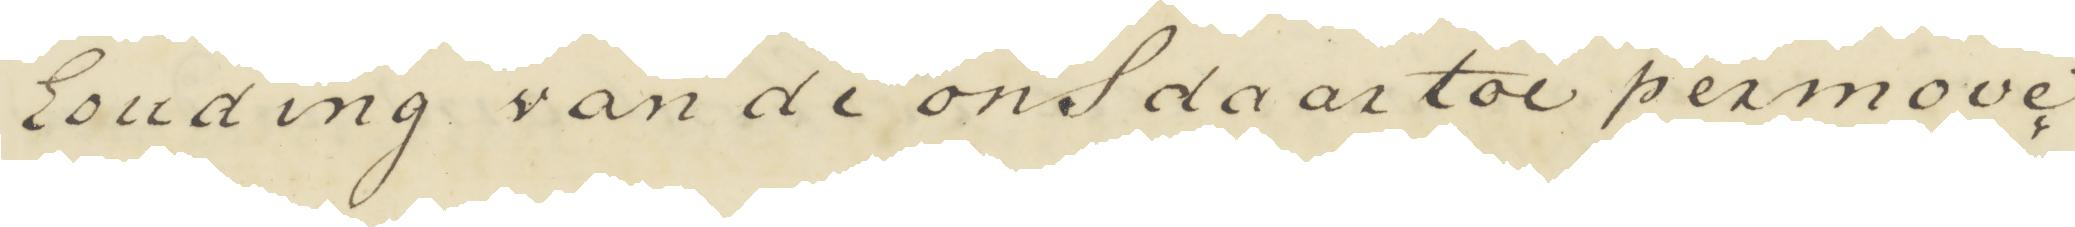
houding van de ons daar toe permove„
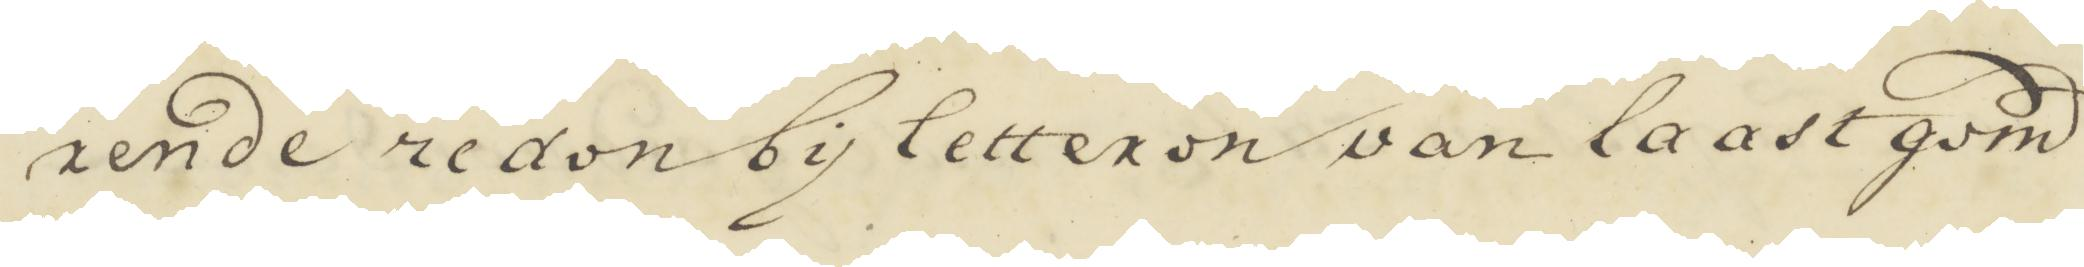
rende reden bij letteren van laast gem
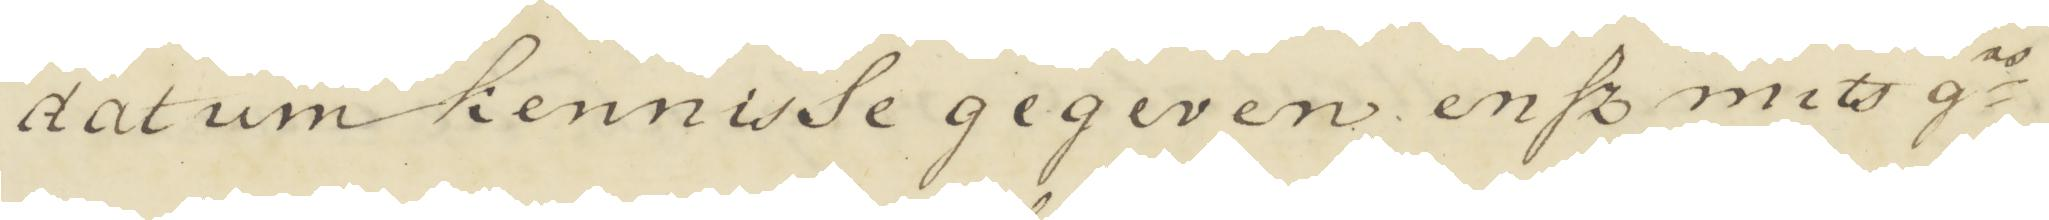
datum kennisse gegeven. ensz mitsg=rs
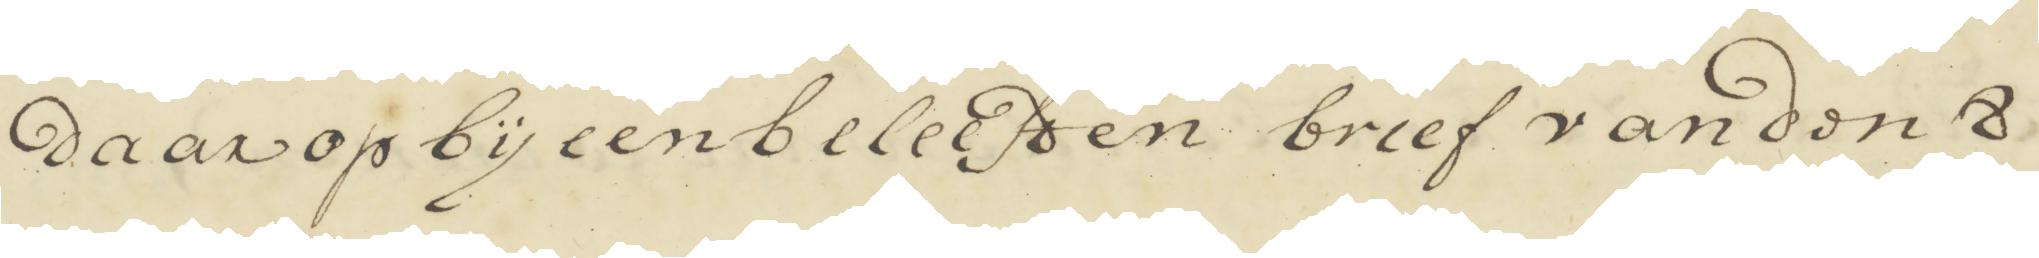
daar op bij een beleefden brief van den 8
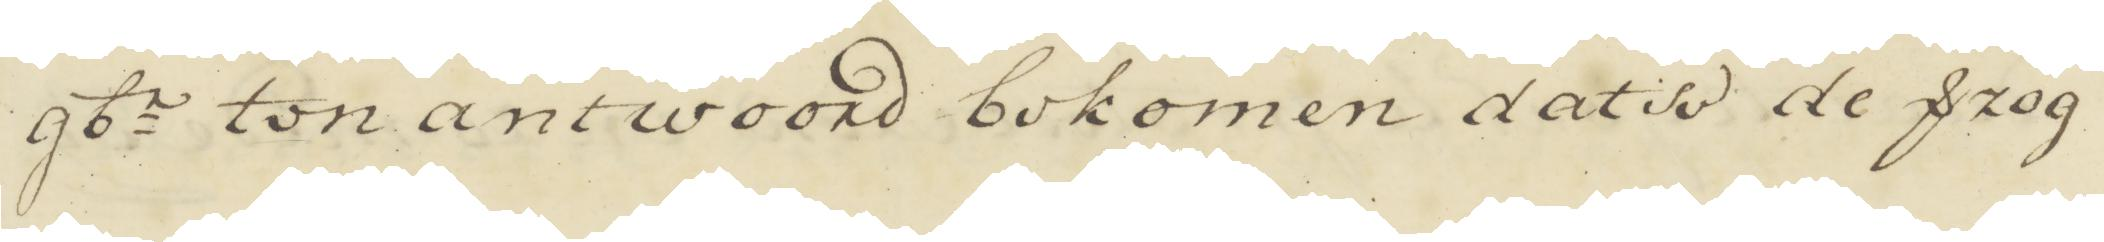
gb=r ten antwoord bekomen datse de verzog
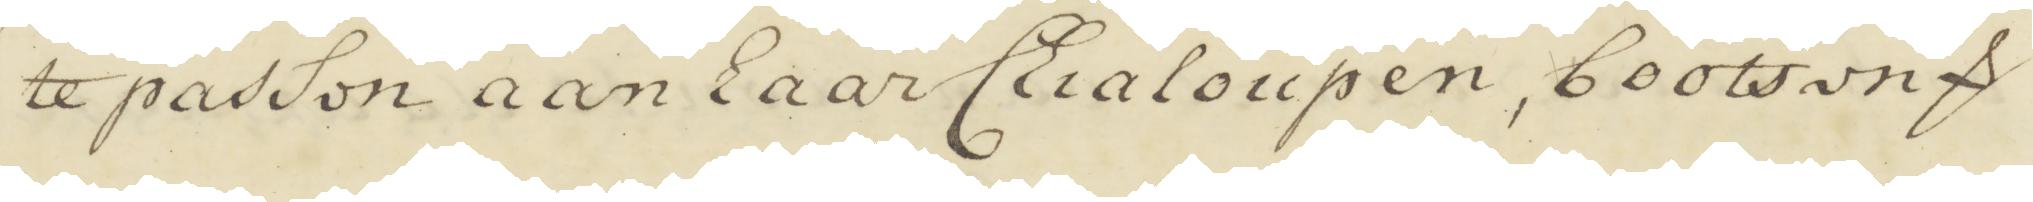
te passen aan haar Chialoupen, bootsen ver
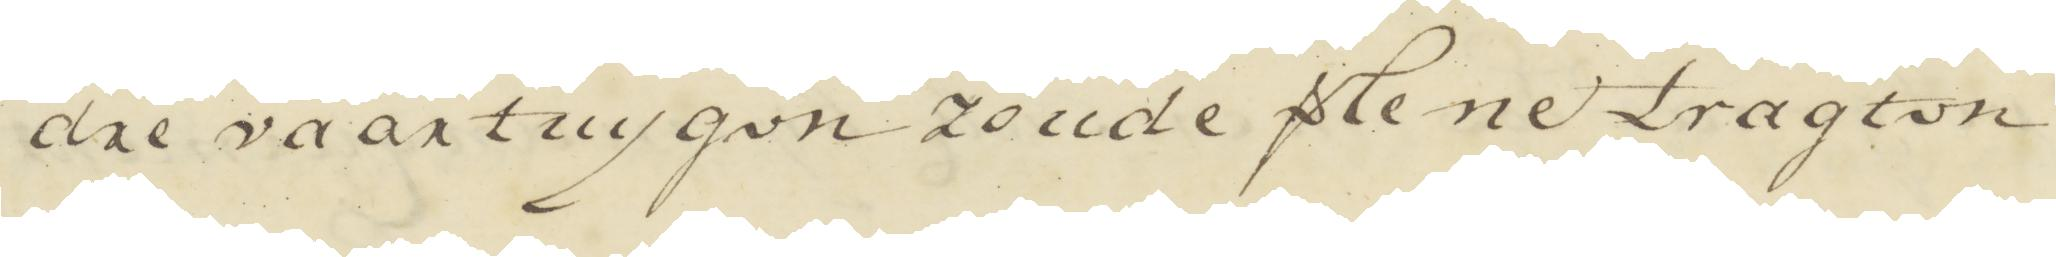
dre vaartuygen zoude verlene tragten
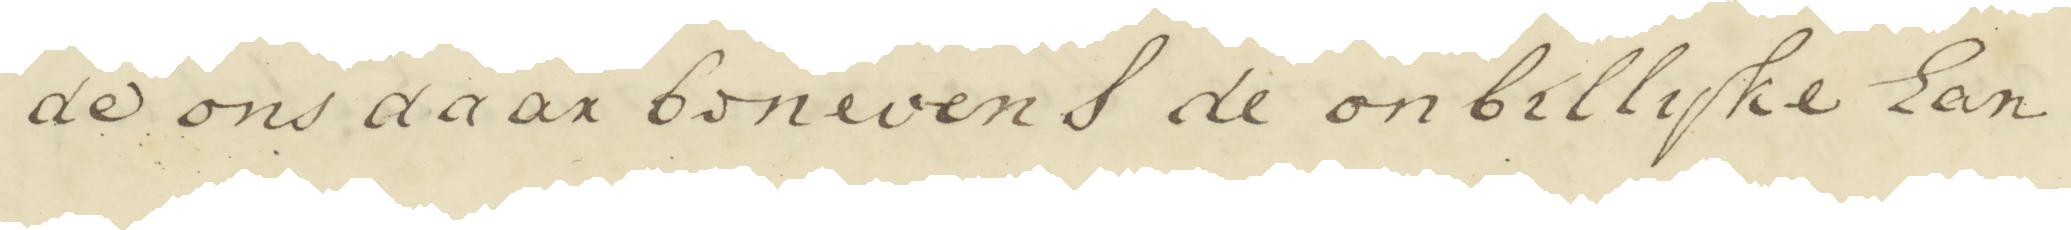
de ons daar benevens de onbillyke han
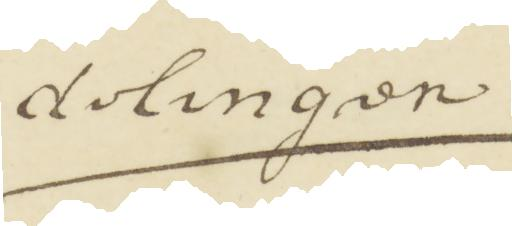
delingen
